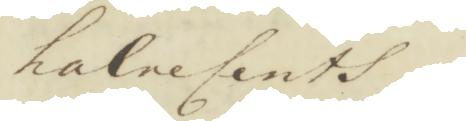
halve Cents _
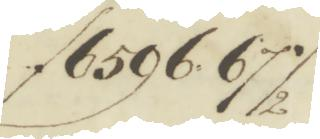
ƒ6596:67 1/2
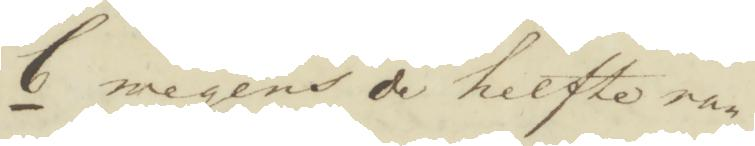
b wegens de helfte van
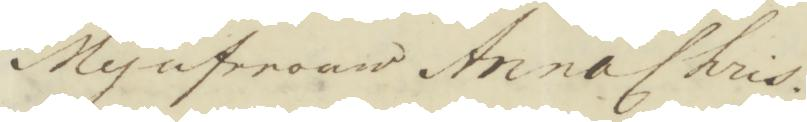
Mejufvrouw Anna Chris,
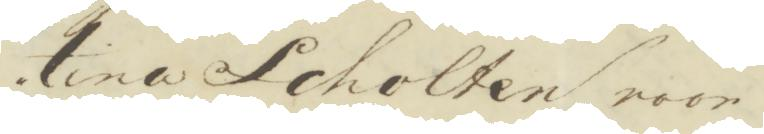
„tina Scholten voor
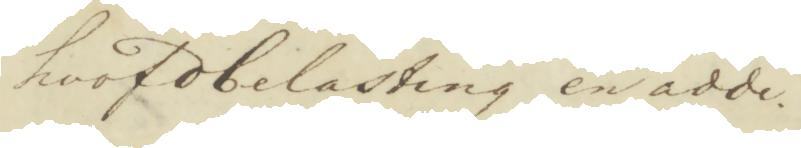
hoofdbelasting en addi,
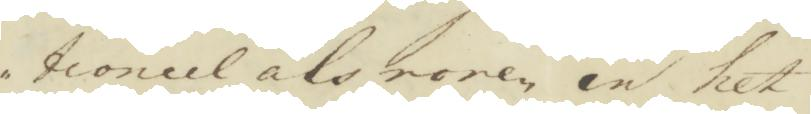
„tioneel als voren en het
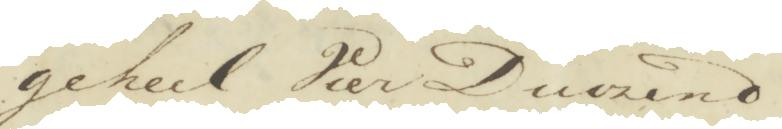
geheel Vier Duizend
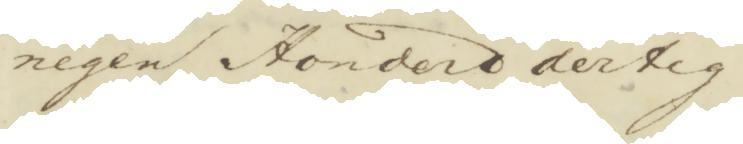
negen Honderd dertig
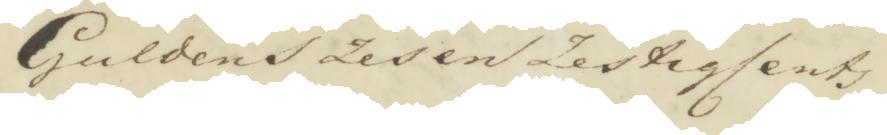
Guldens zes en zestig Cents
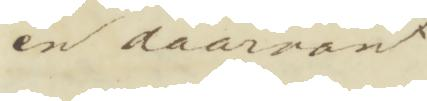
en daarvan
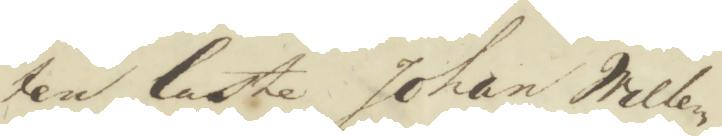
ten laste Johan Willen
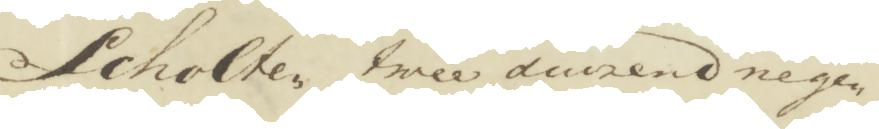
Scholten twee duizend negen
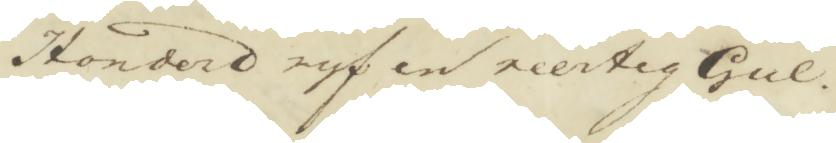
Honderd vyf en veertig Gul,
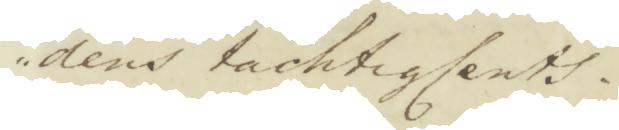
„dens tachtig Cents .
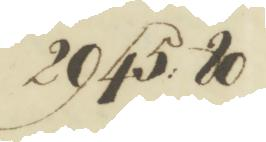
2945: 80
